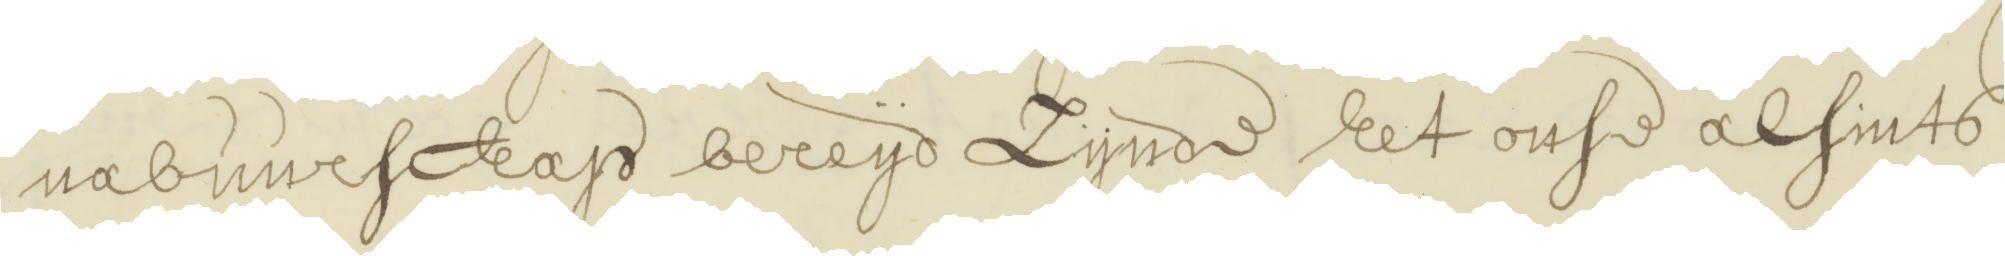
nabuurschap bereijd zijnde het onse alsints
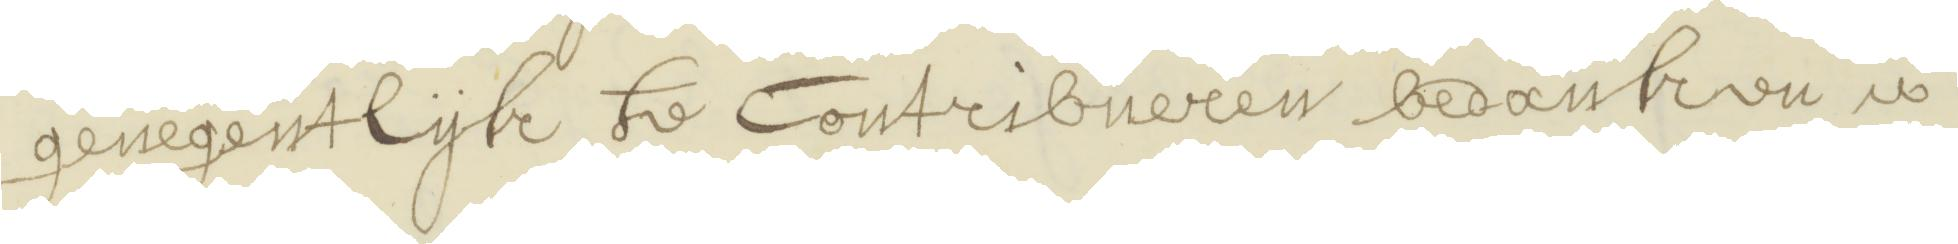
genegentlijk te contribueren bedanken w'
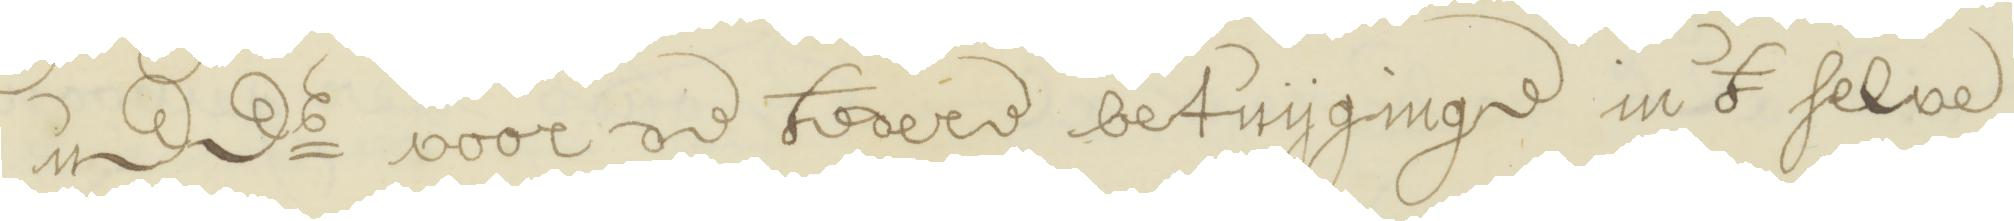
uEE=s voor de tedere betuijginge in ’t selve
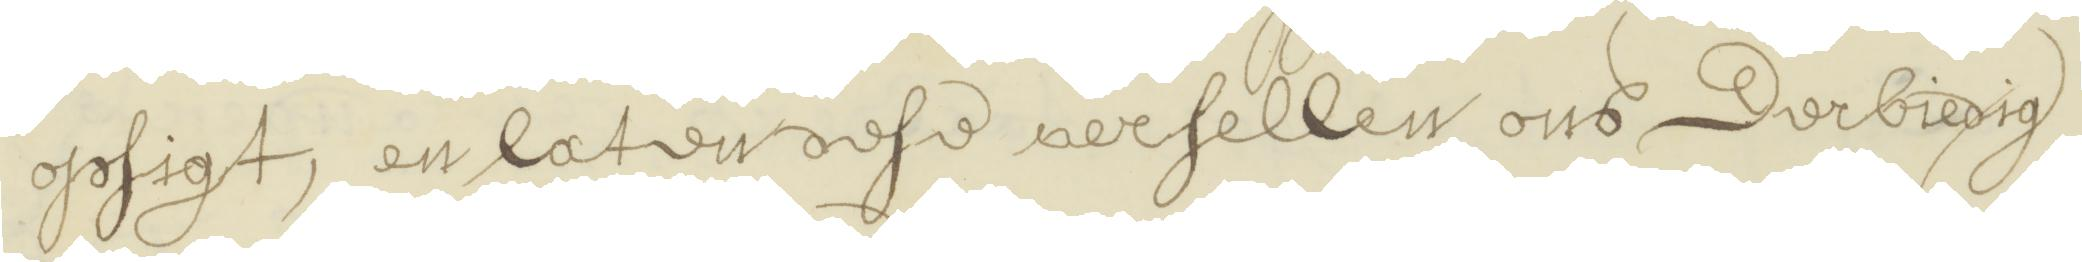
opsigt, en laten dese versellen ons Eerbiedig
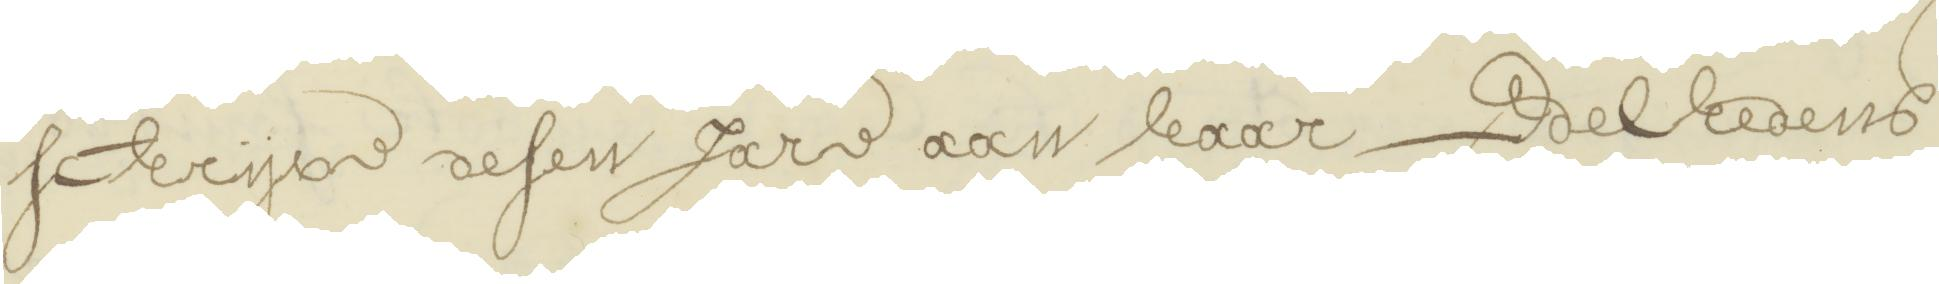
schrijve desen Jare aan haar Edelhedens
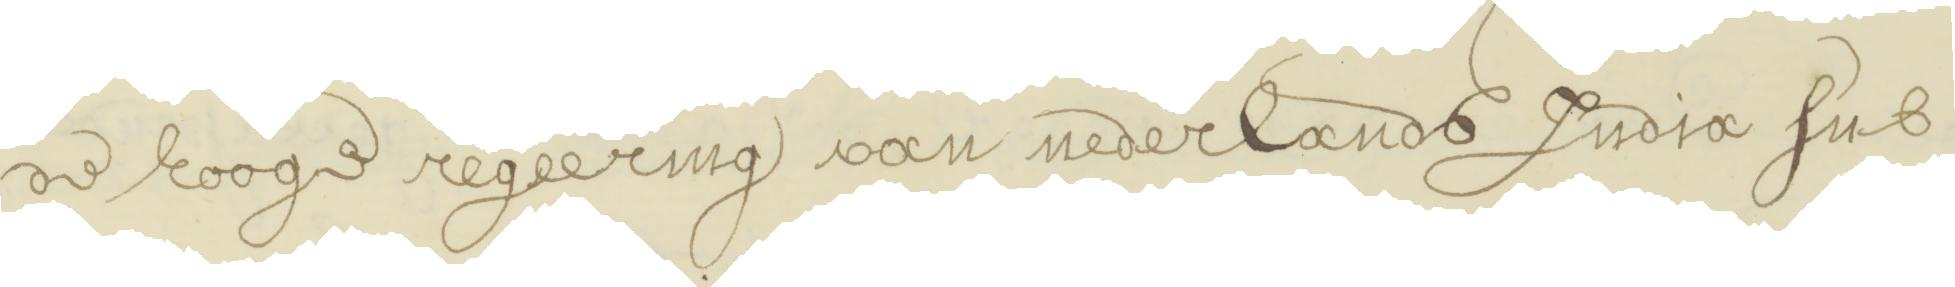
de hooge regeering van nederlands Jndia sub
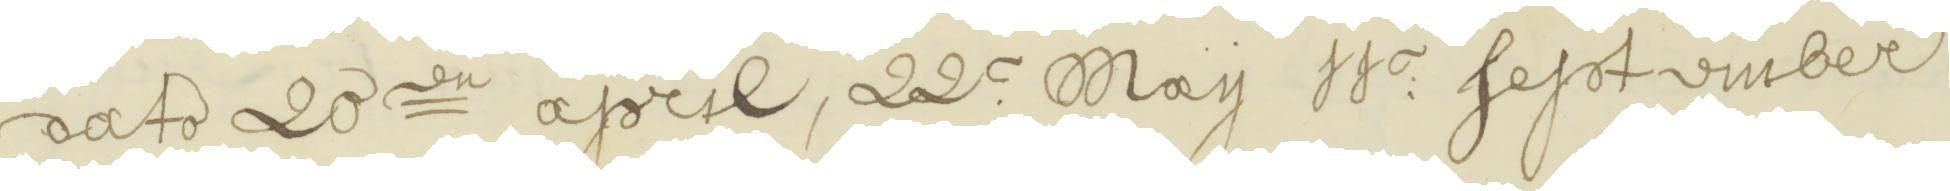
dato 20=en april, 22.' Maij 11:' september
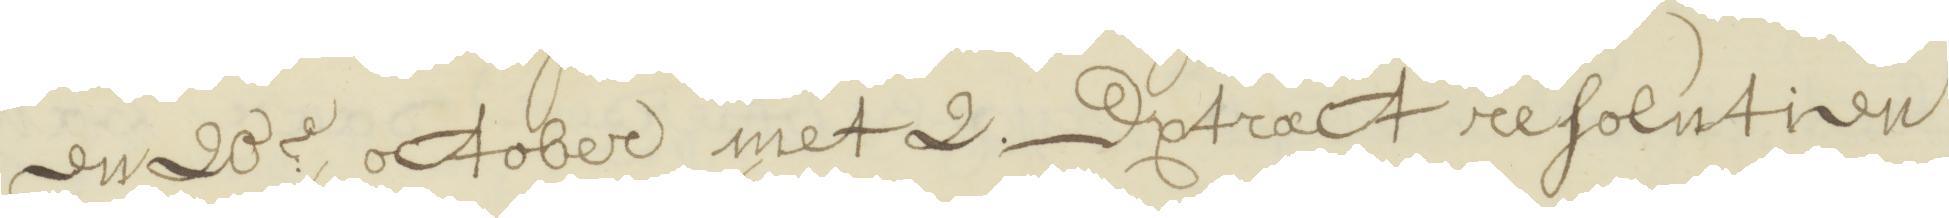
en 20:e october met 2. Extract resolutien
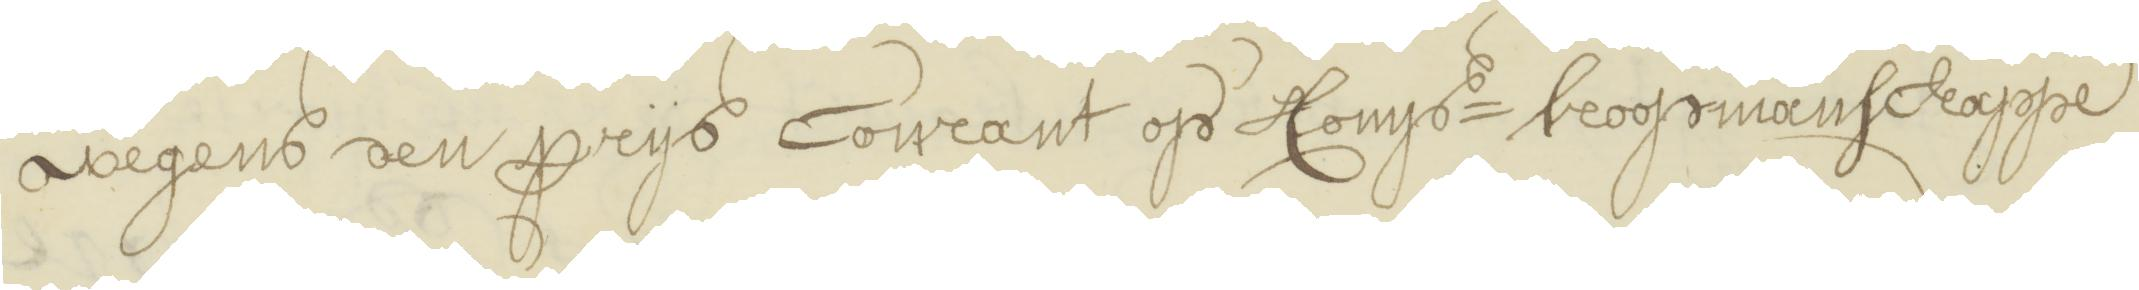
wegens den prijs courant op 'sComp=s koopmanschappe
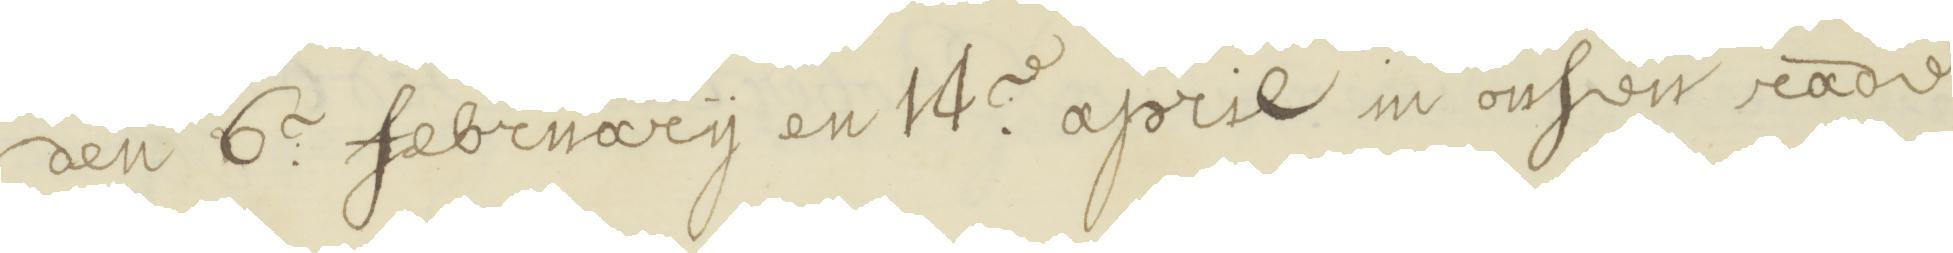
den 6:' februarij en 14:e april in onsen rade
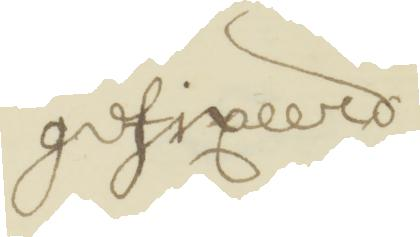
gefixeerd
